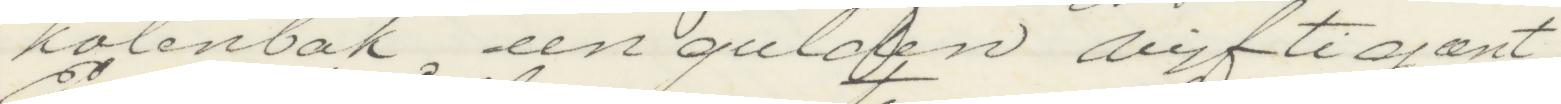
kolenbak een gulden vijftig cent
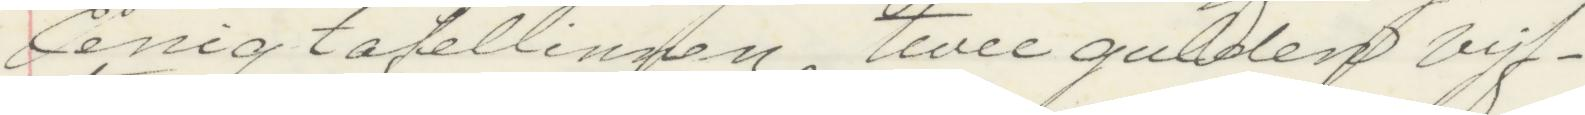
Eenig tafellinnen, twee gulden vijf-
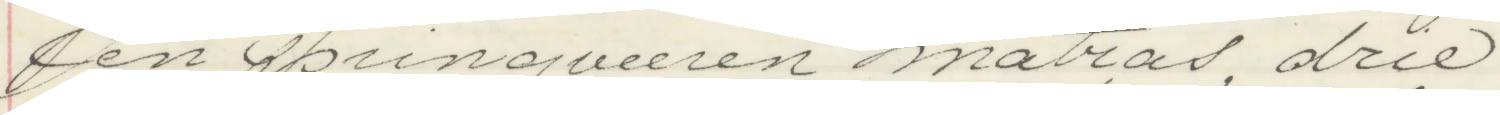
Een springveeren matras, drie
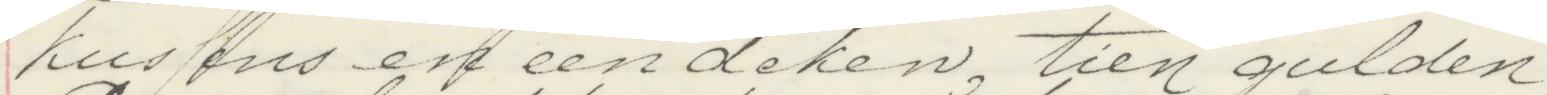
kussens en een deken, tien gulden
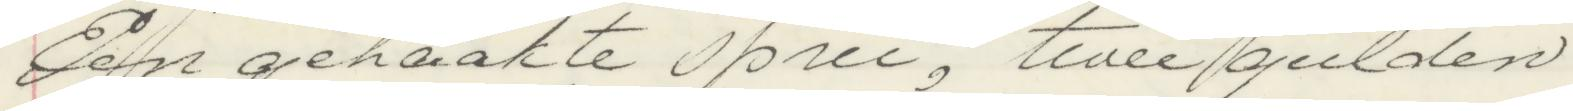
Een gehaakte sprei, twee gulden
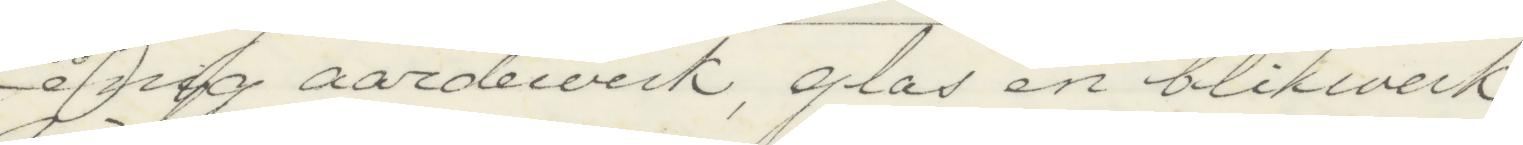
Eenig aardewerk, glas en blikwerk
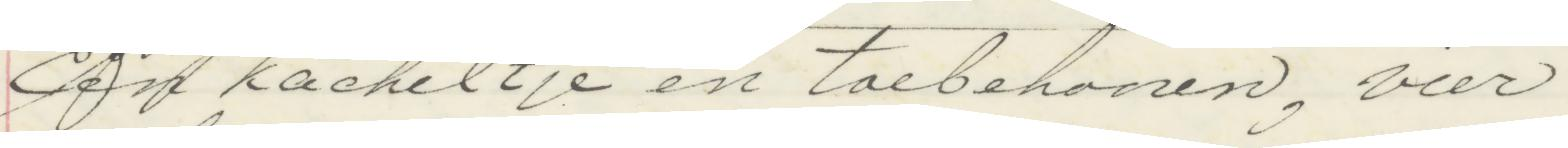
En kacheltje en toebehooren, vier
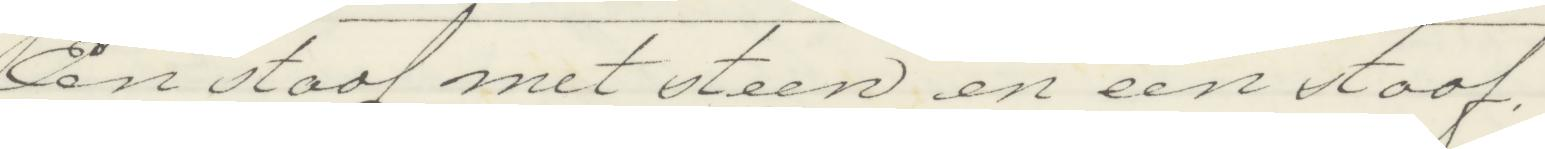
Een stoof met steen en een stoof,
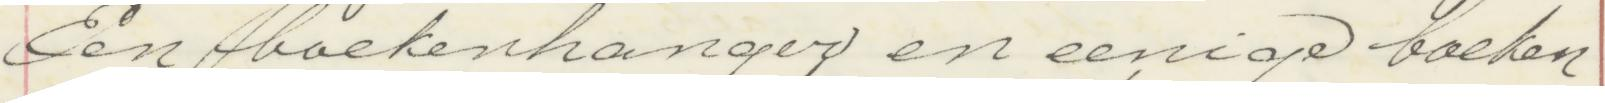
Een boekenhanger en eenige boeken
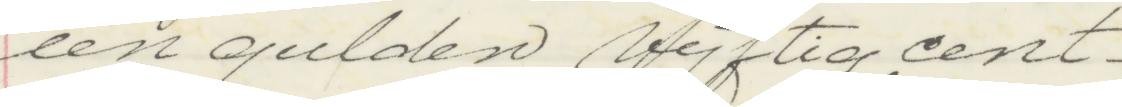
een gulden vijftig cent
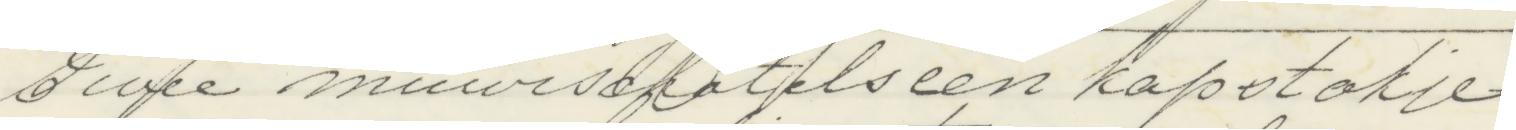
Twee muurschotels een kapstokje
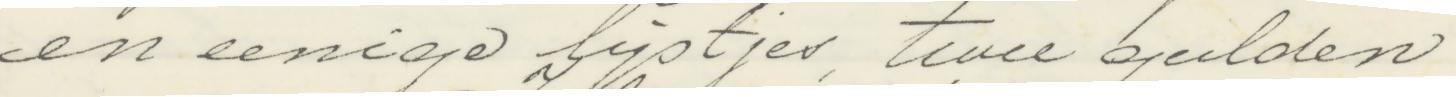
en eenige lijstjes, twee gulden
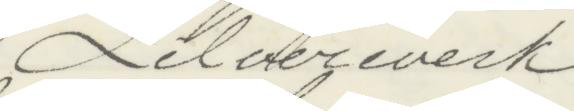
Zilverwerk
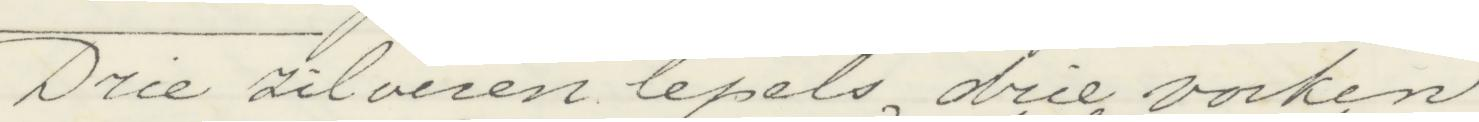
Drie zilveren lepels, drie vorken
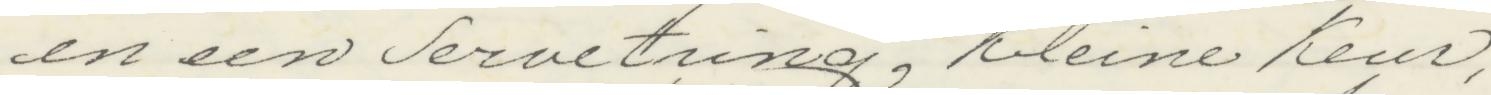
en een Serveting, Kleine keur,
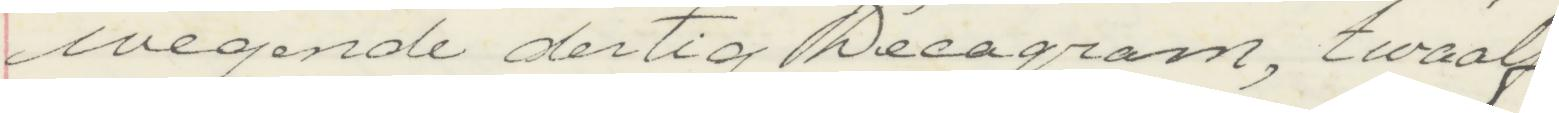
wegende dertig Decagram, twaalf
